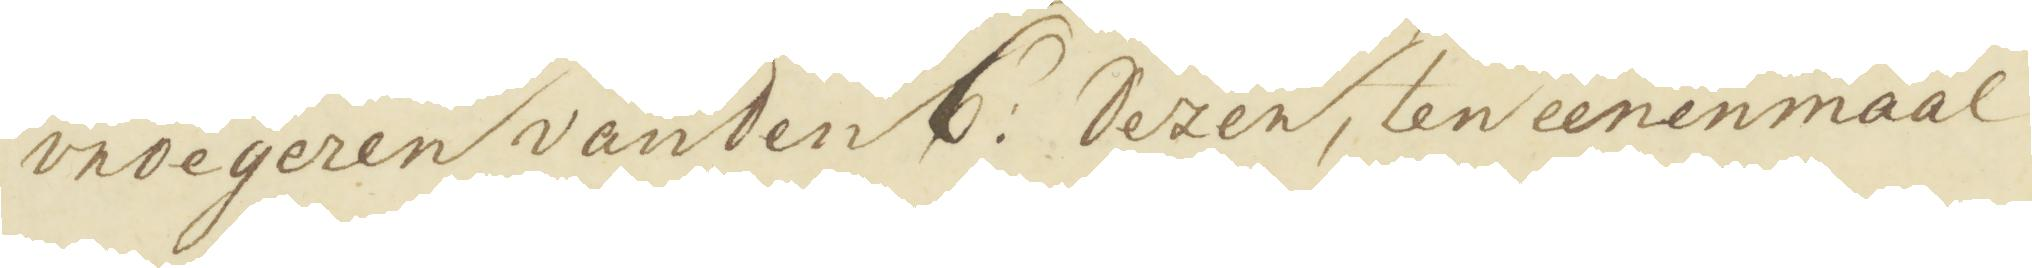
vroegeren van den 6:' dezer, ten eenenmaal
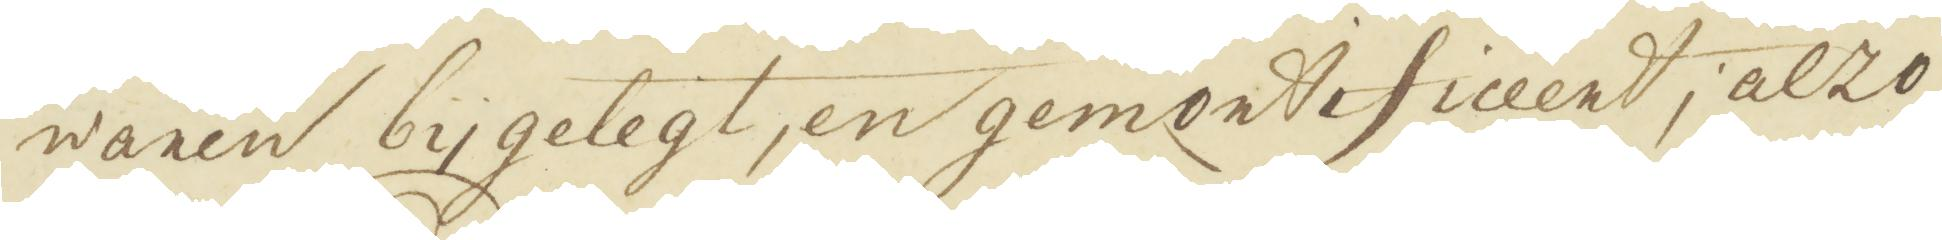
waren bijgelegt, en gemortificeert; alzo
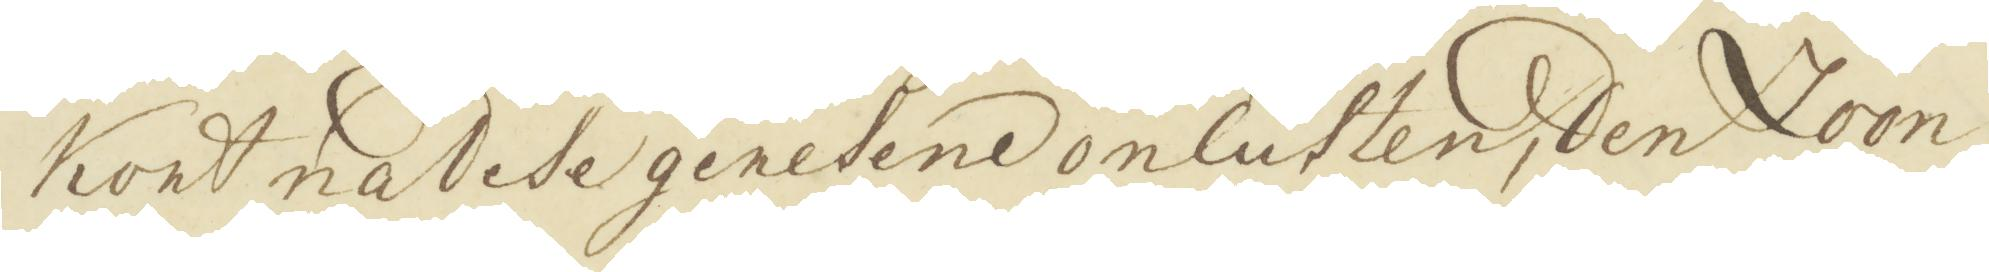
Kort na dese geresene onlusten, den Zoon
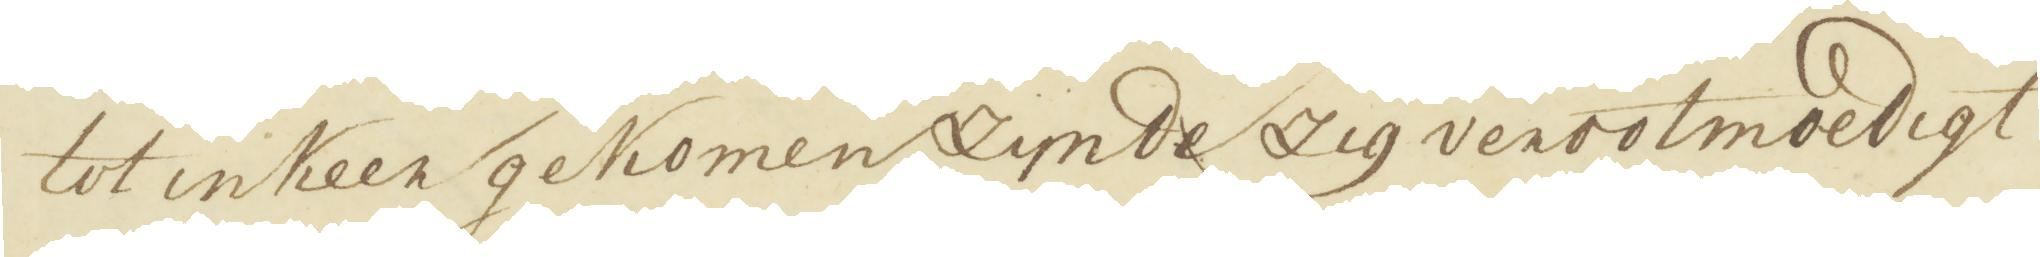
tot in keer gekomen zijnde zig verootmoedigt
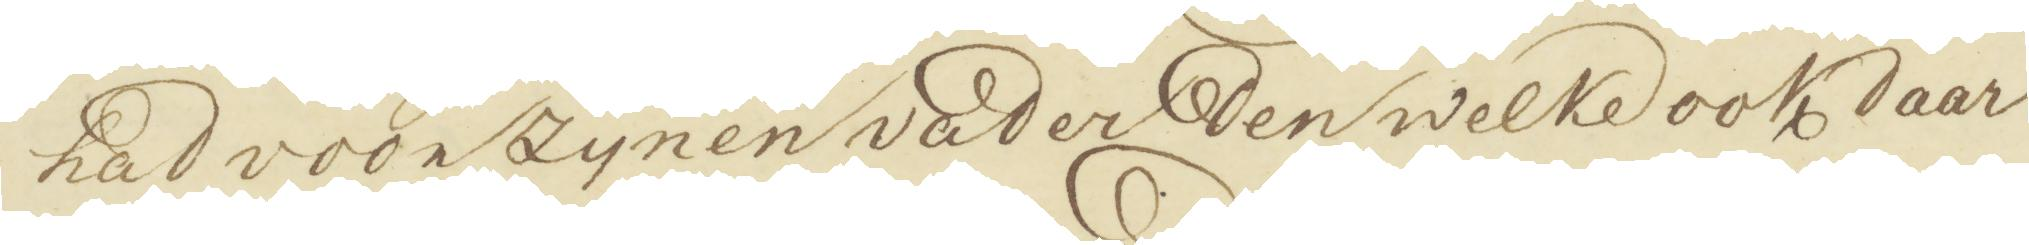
had voor zijnen vader den welke ook daar
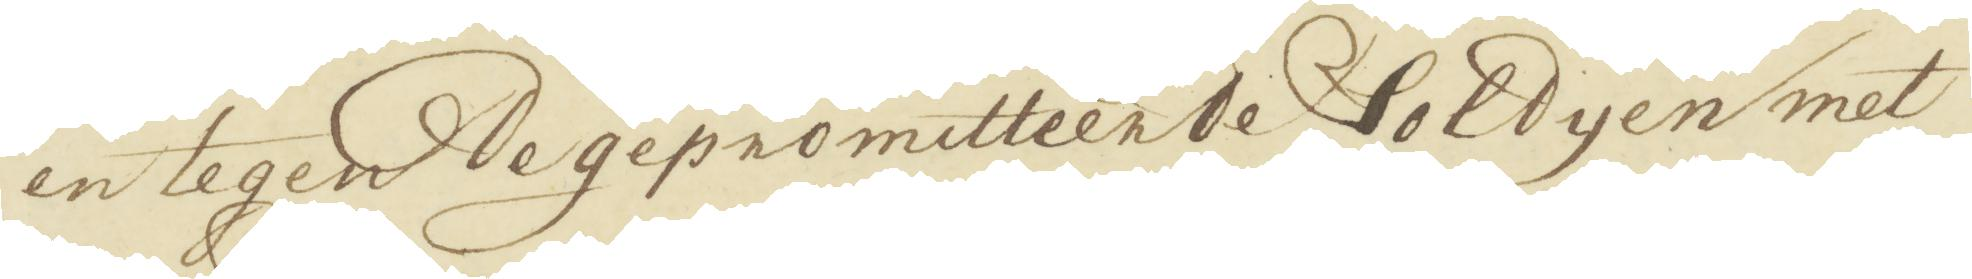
en tegen De gepromitteerde Soldijen met
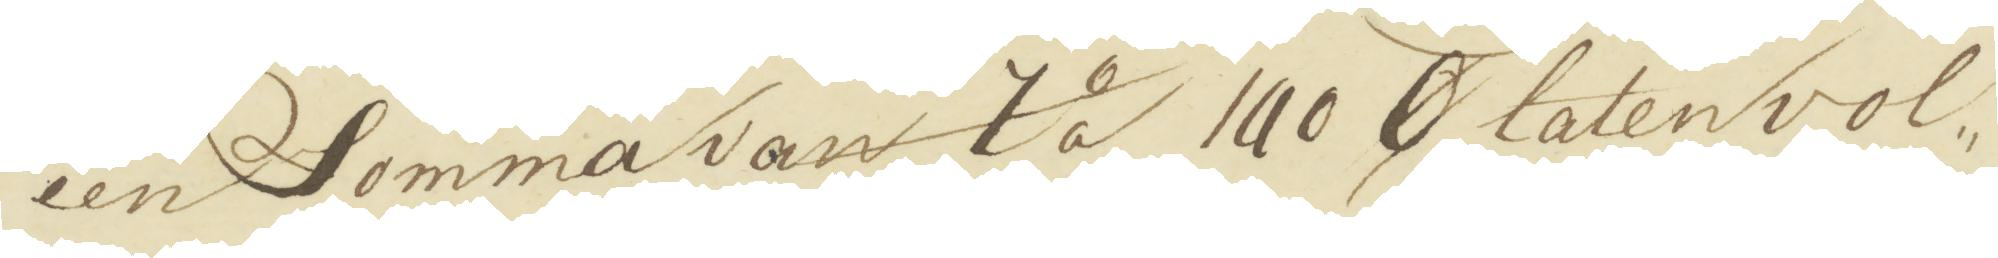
een Somma van R o/a 140 Ø laten vol„
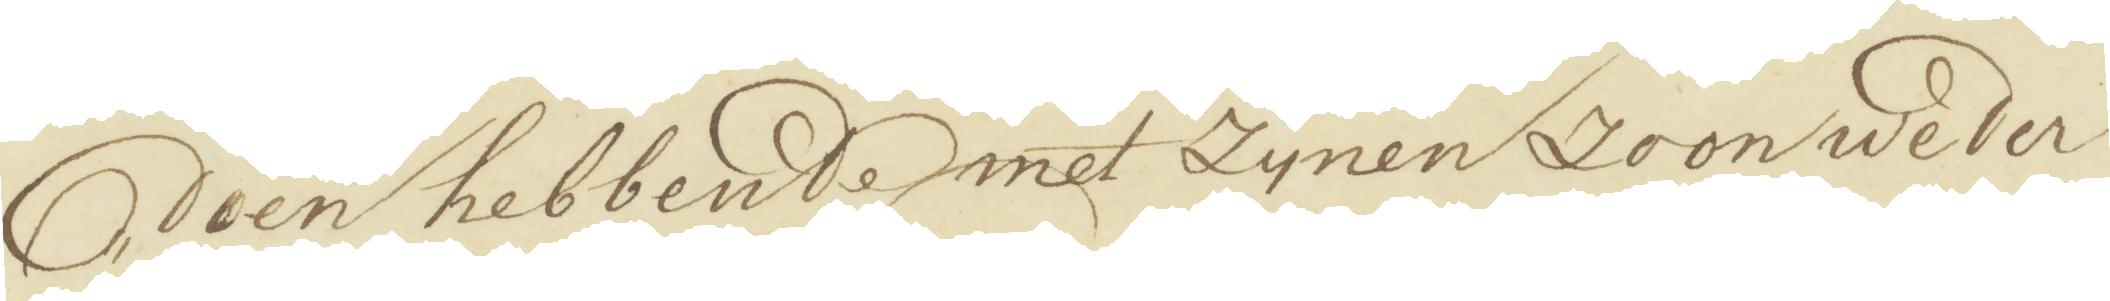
„doen hebbende met Zijnen Zoon weder
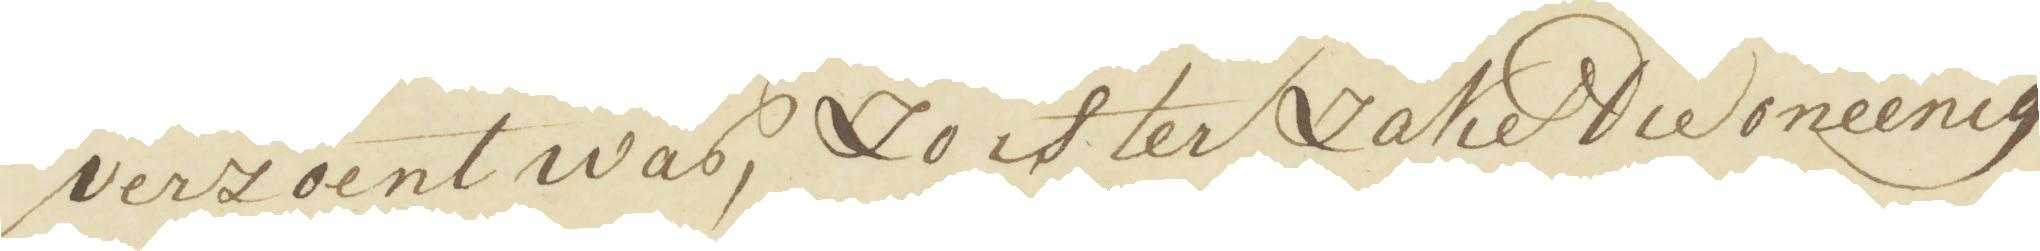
verzoent was, Zo is ter zake die oneenig
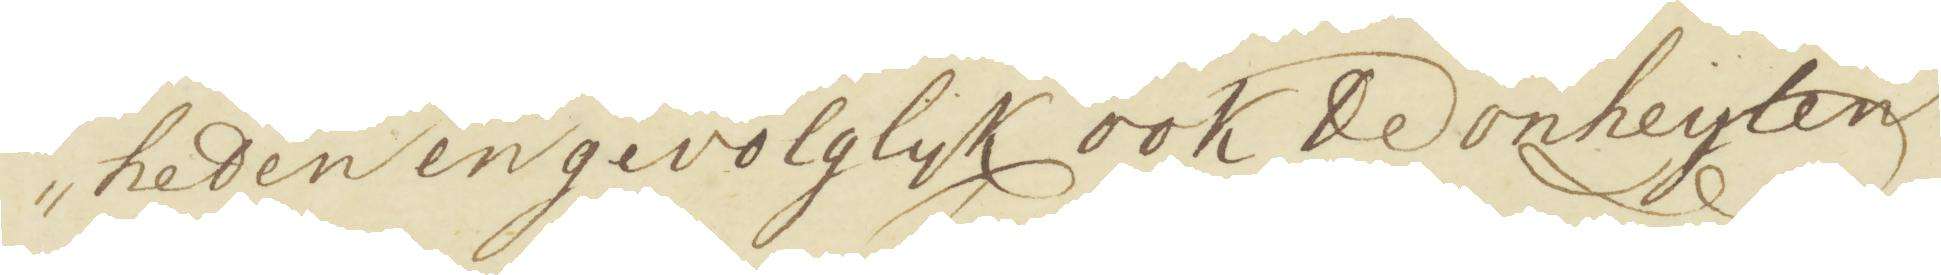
„heden en gevolglijk ook de onheijlen
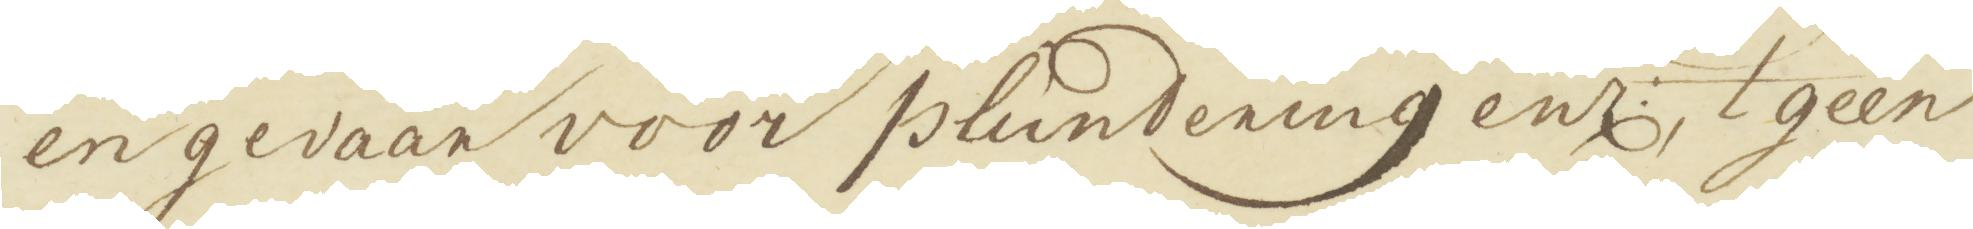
en gevaar voor plundering enz=, 't geen
